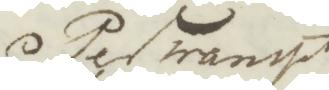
Per Transpt
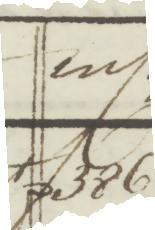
ƒ 326
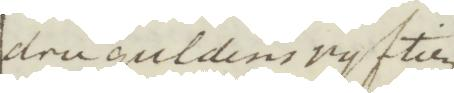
drie guldens vyftien
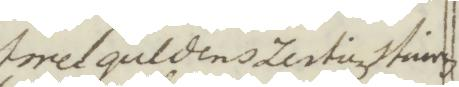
twee guldens zestien stuivers
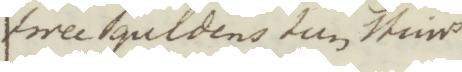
twee guldens tien stuivs
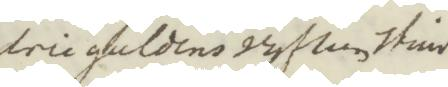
drie guldens vyftien stuivs
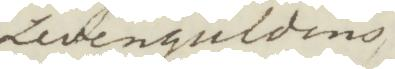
zeven guldens,
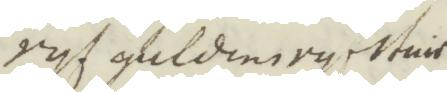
vijf guldens vyf stuivs
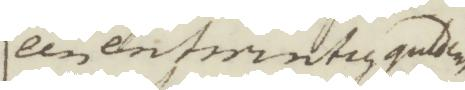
een en twintig gulden
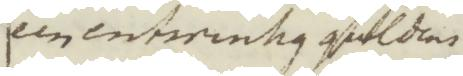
een en twintig guldens
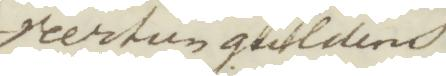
veertien guldens
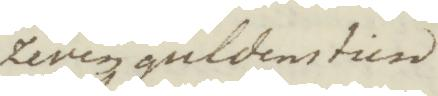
zeven guldens tien
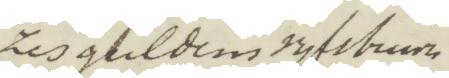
zes guldens vyf stuiv
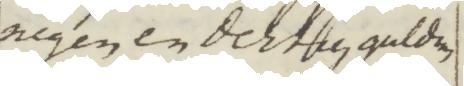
negen en dertig gulden
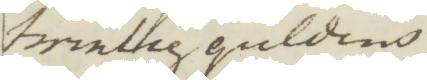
twintig guldens
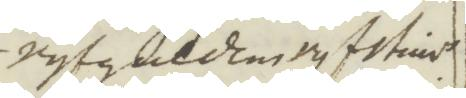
vyf guldens vyf stuivs
